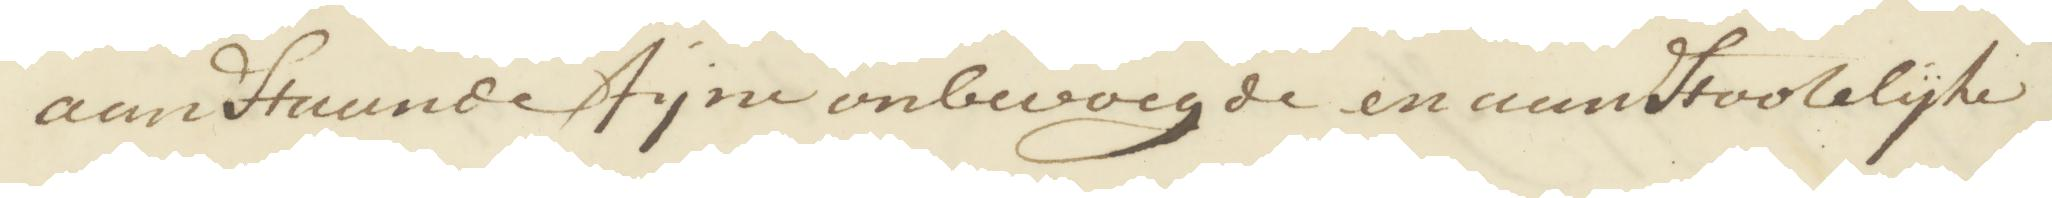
aanstaande fijne onbevoegde en aanstootelijke
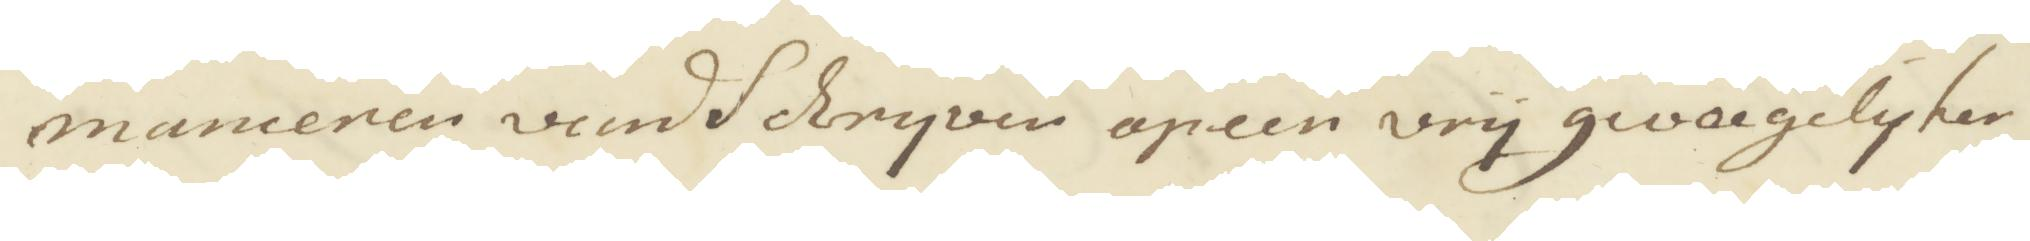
manieren van schrijven op een vrij gevoegelijker
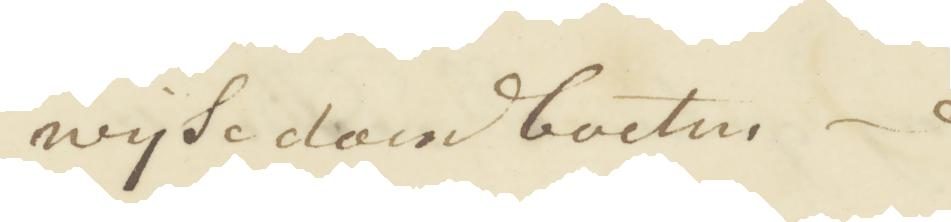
wijse doen boeten.
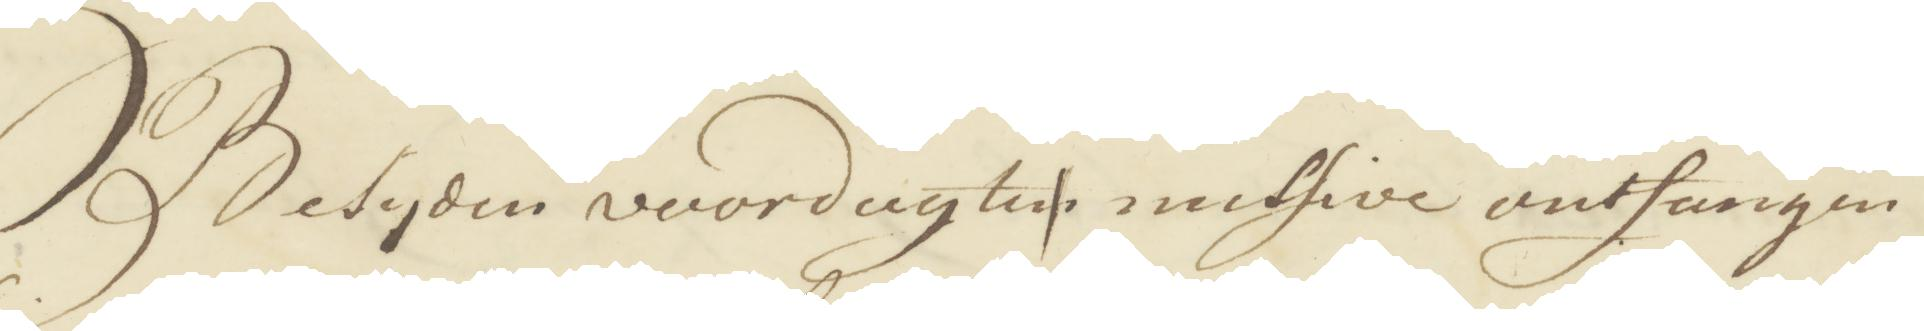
Besyden voordagten missive ontfangen
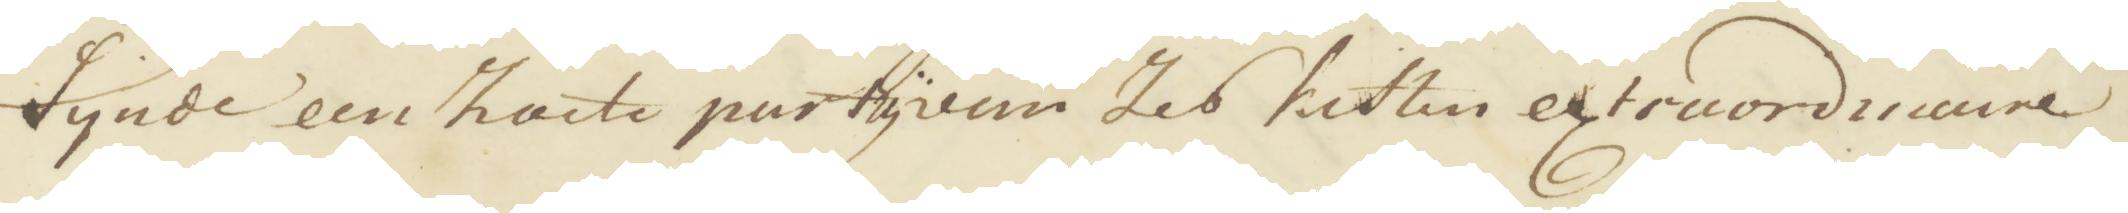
synde een zoete partij van zes kisten extraordinaire
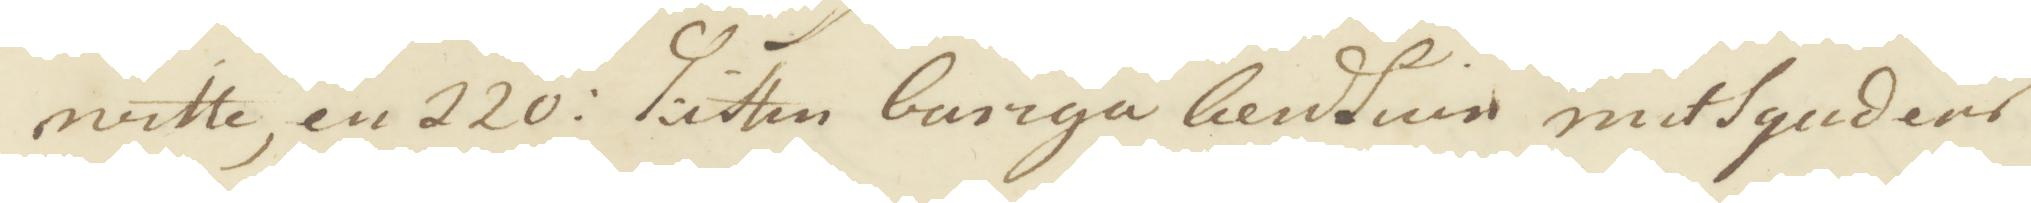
witte, en 220: kisten bariga bensuin mitsgaders
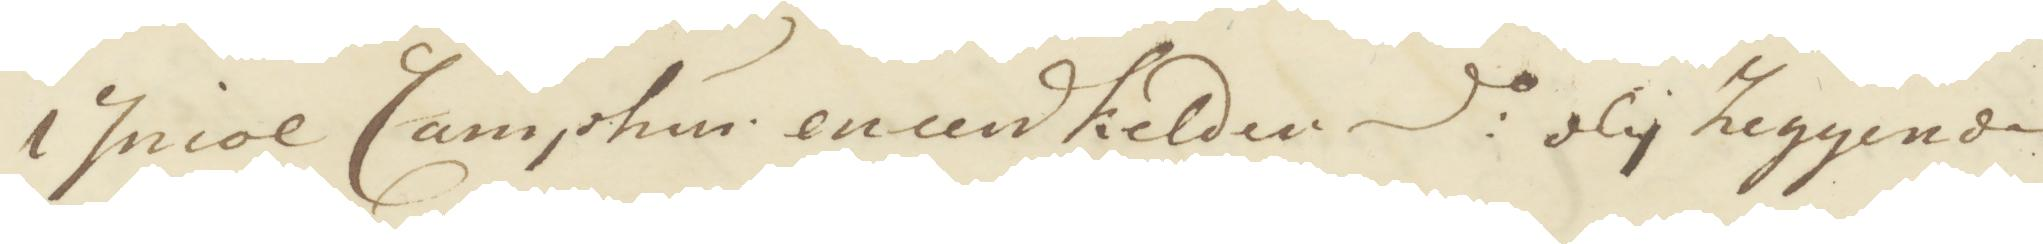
1 priol Camphur en een kelder d:o olij zeggende
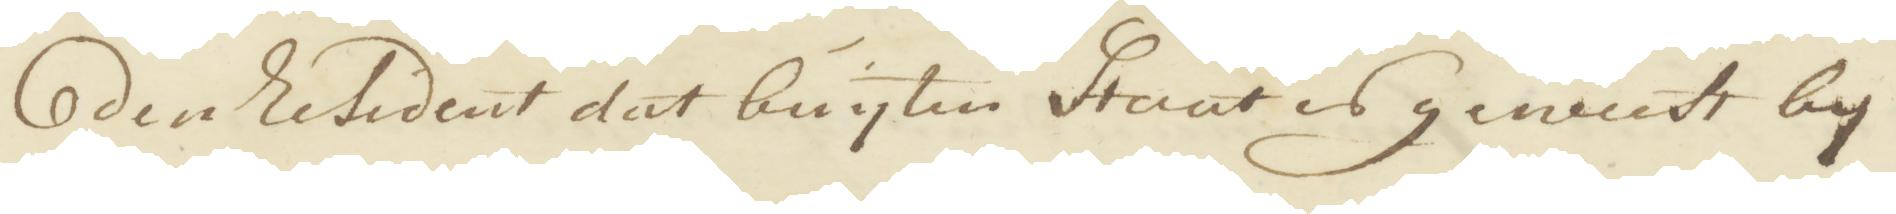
den resident dat buijten staat is geweest by
